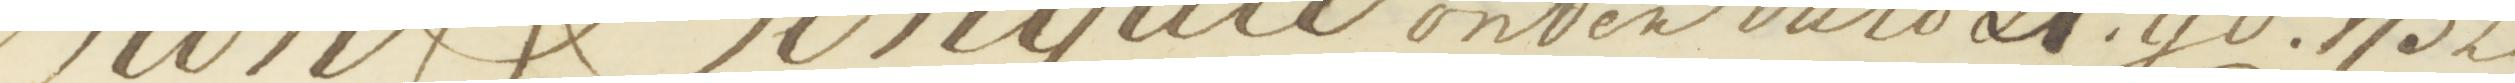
Van Bengale onder dato 21:' 9b: 1732.
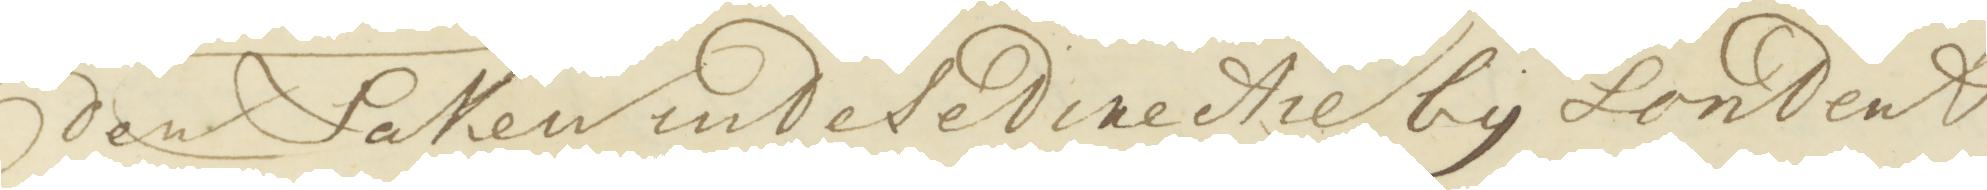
den Saken in dese directie bij Sonder 't
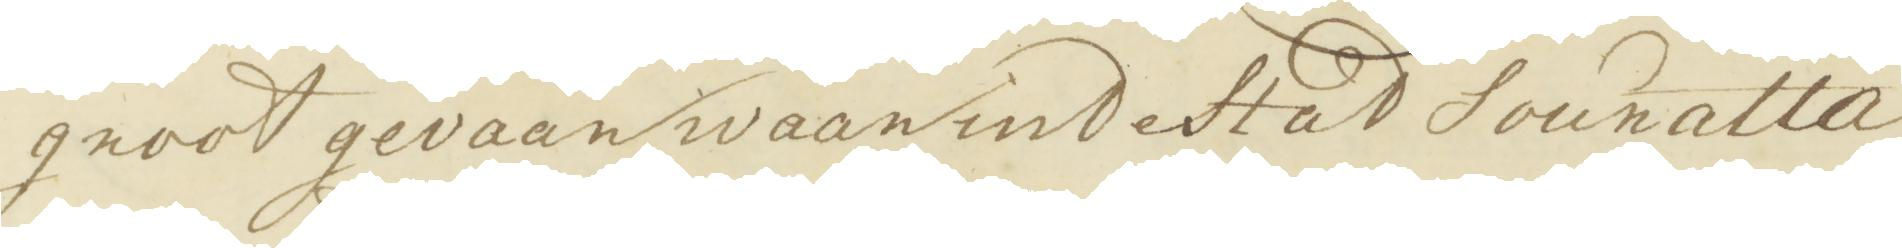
groot gevaar waarin de Stad Souratta
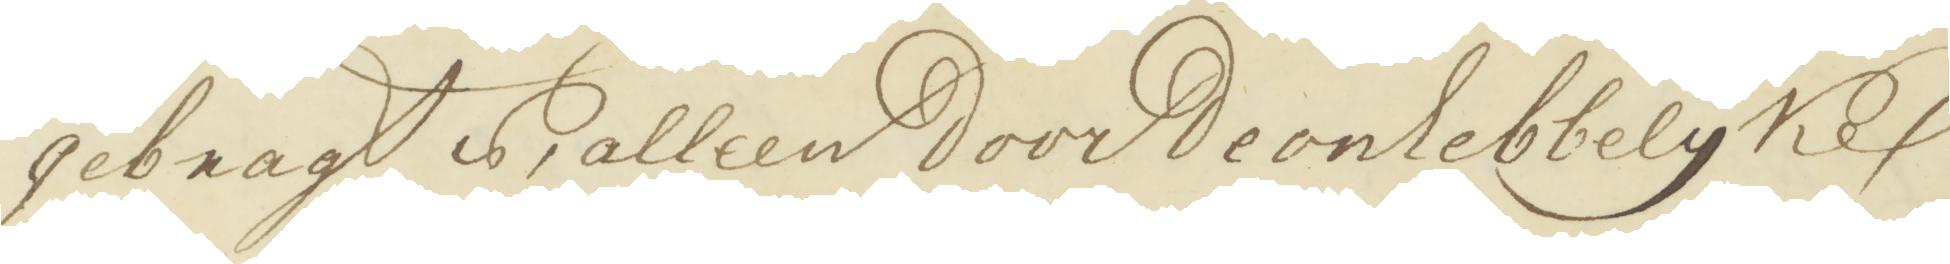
gebragt is, alleen door de onhebbelijke
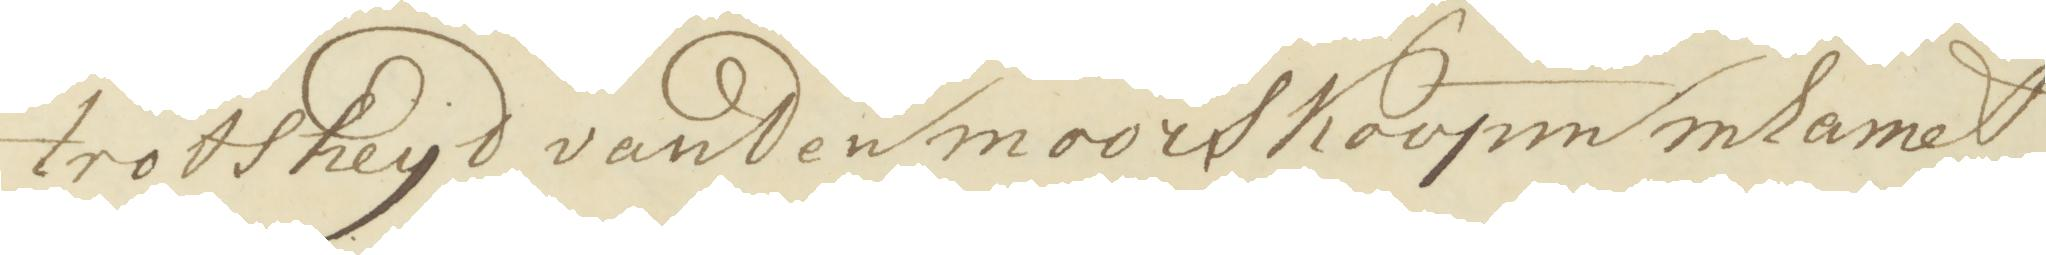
trotsheijd van den moors Koopman mhamet
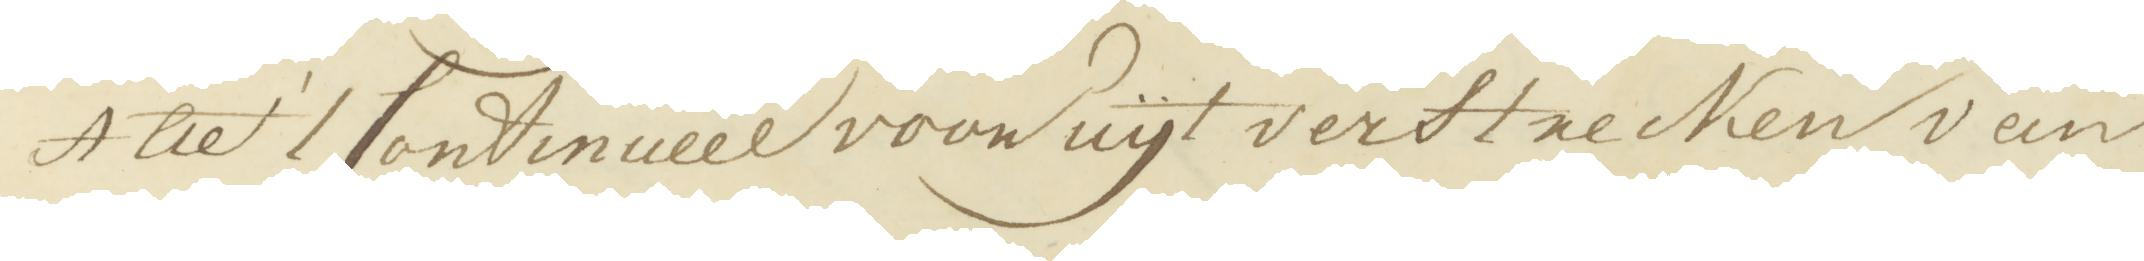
alie ’t Continueel voor uijt verstrecken van
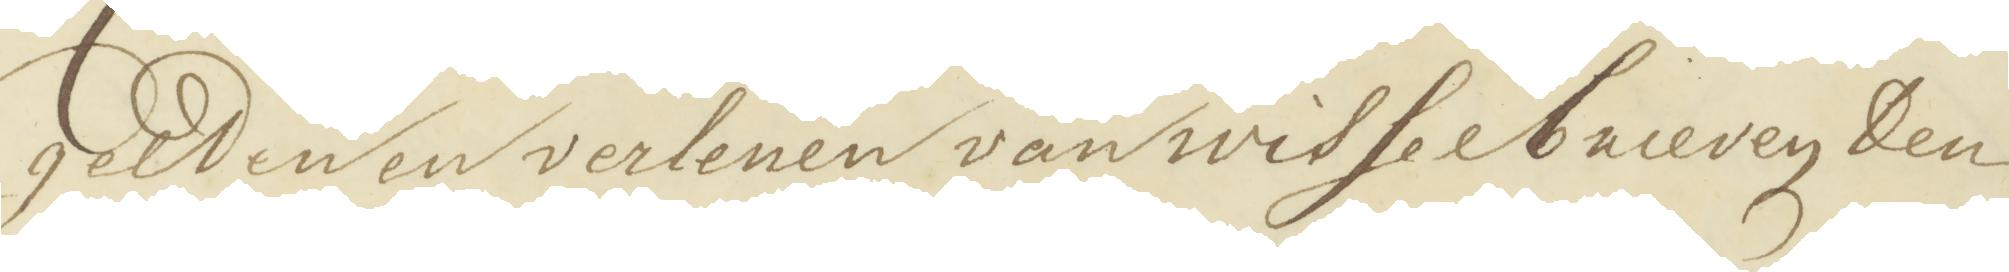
gelden en verlenen van wisselbrieven den
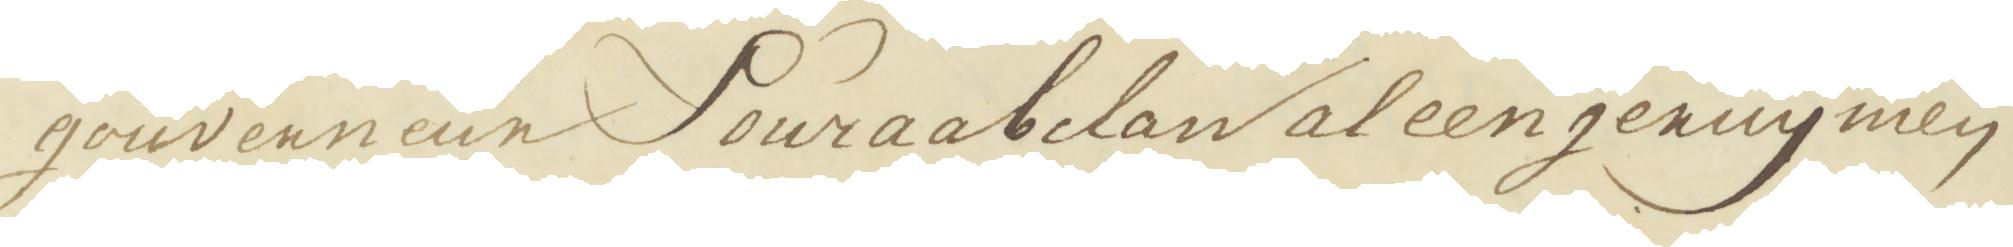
gouverneur Souraabchan al een geruijmen
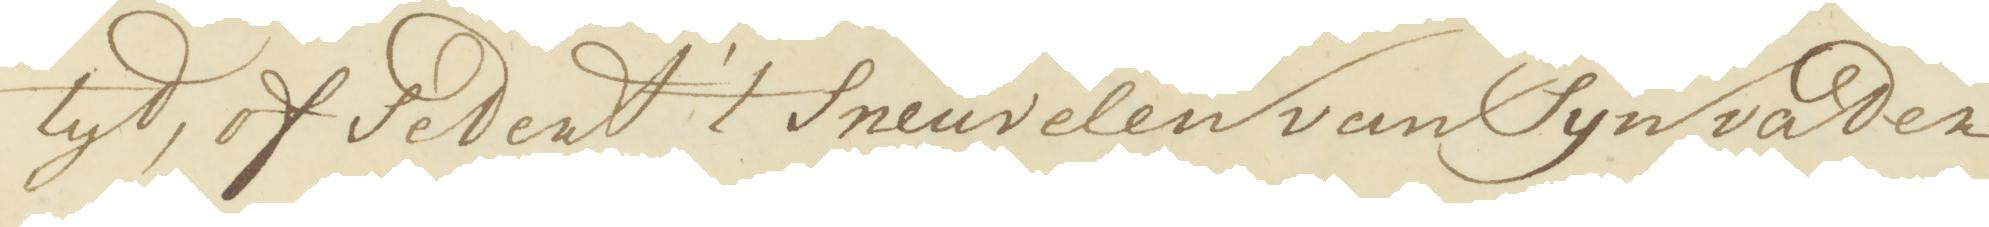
tyd, of sedert 't Sneuvelen van Sijn vader
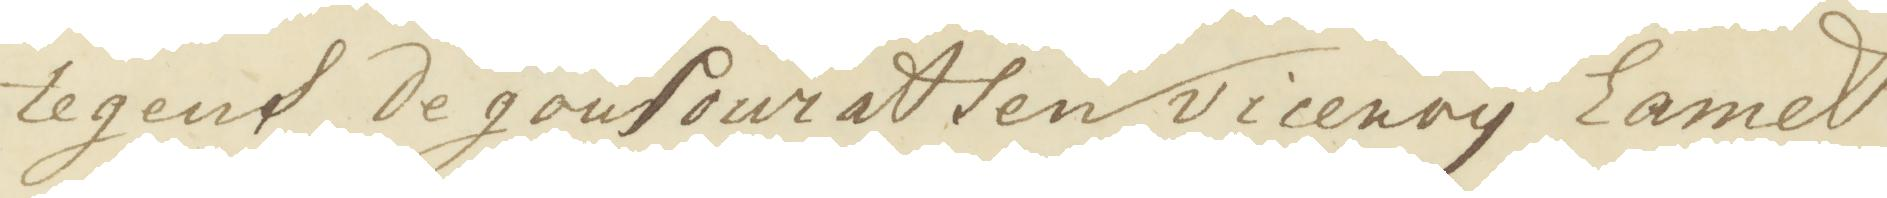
tegens de gousouratsen viceroij hamet
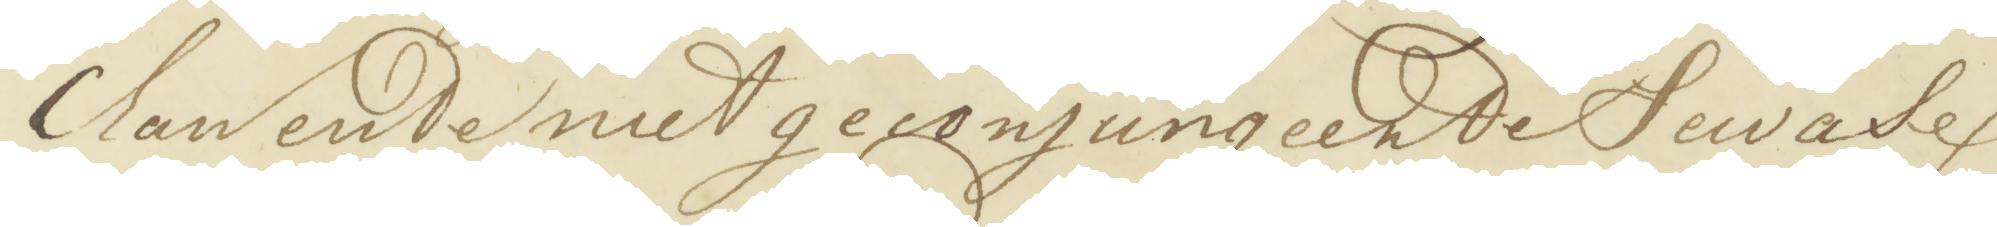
Chan en de niet geconjungeerde Sewase
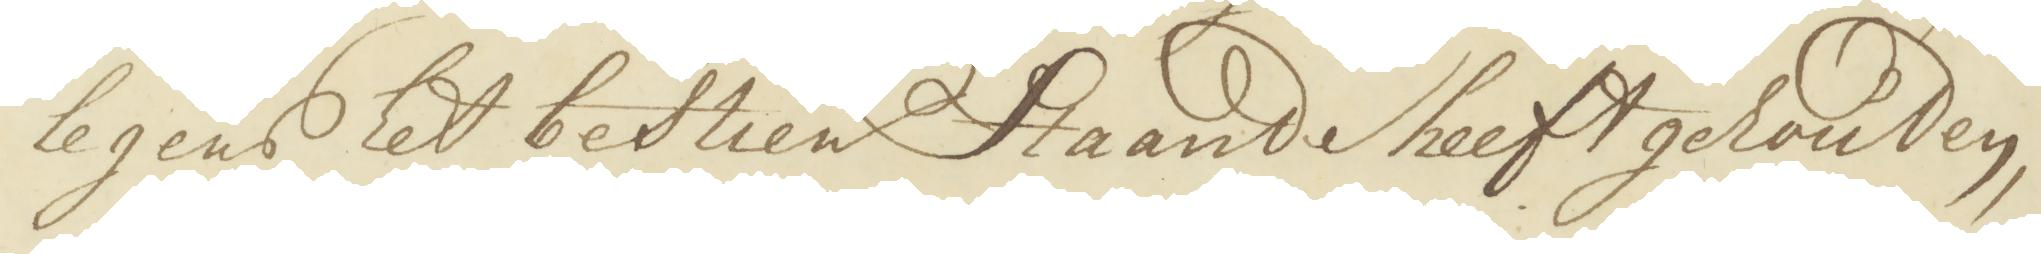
legers het bestier Staande heeft gehouden,
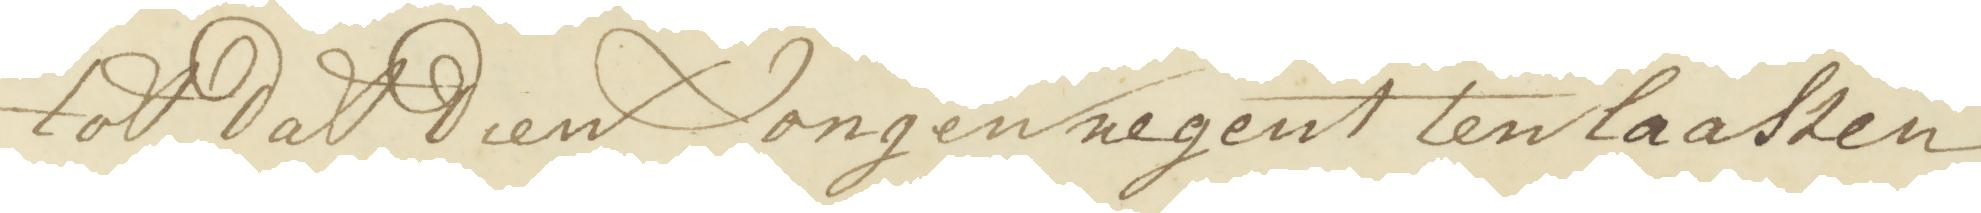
tot dat dien Iongen regent ten laasten
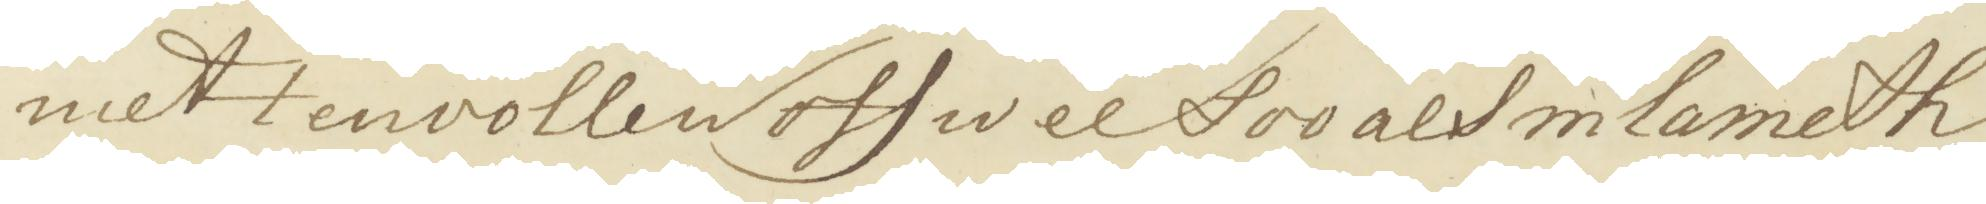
niet ten vollen off wel Soo als mhameth
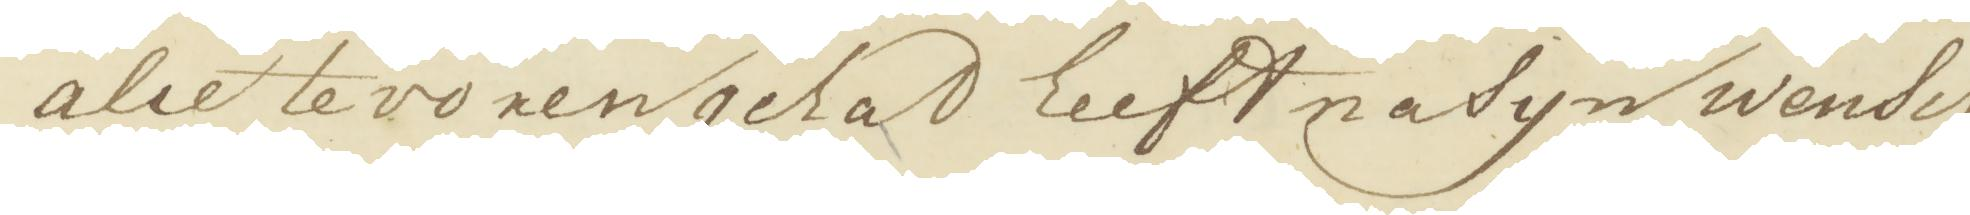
alie te voren gehad heeft na syn wensch
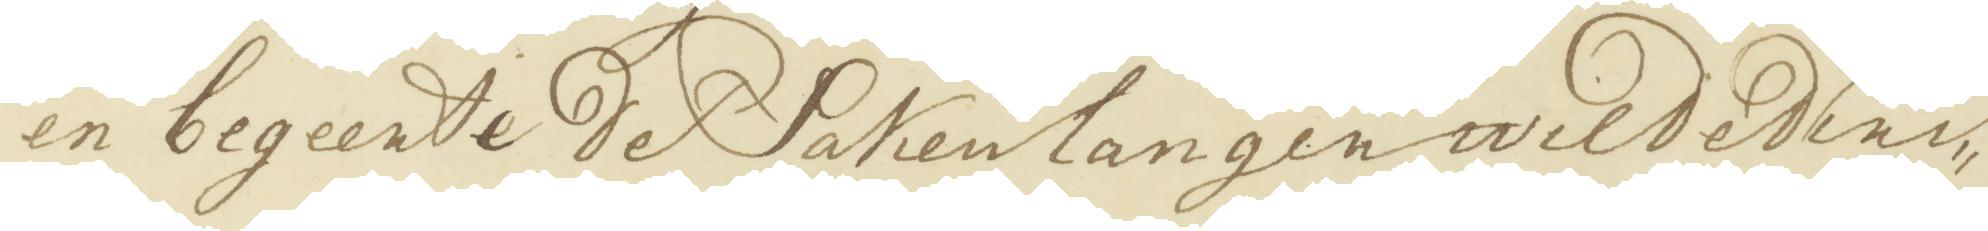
en begeerte de Saken langer wilde diri„
